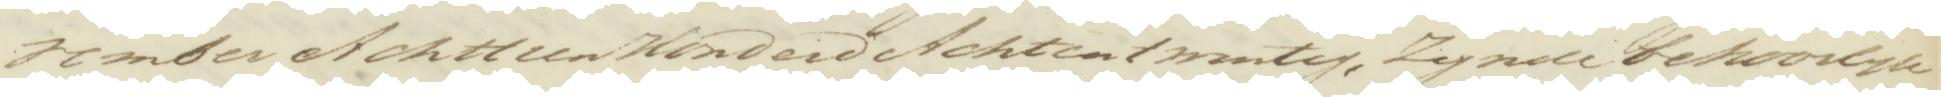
vember Achttien Honderd Achtentwintig, Zynde behoorlyk
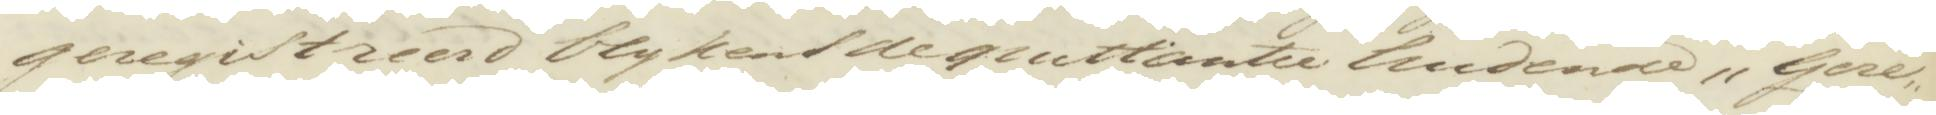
geregistreerd blykens de quitantie luidende „ Gere„
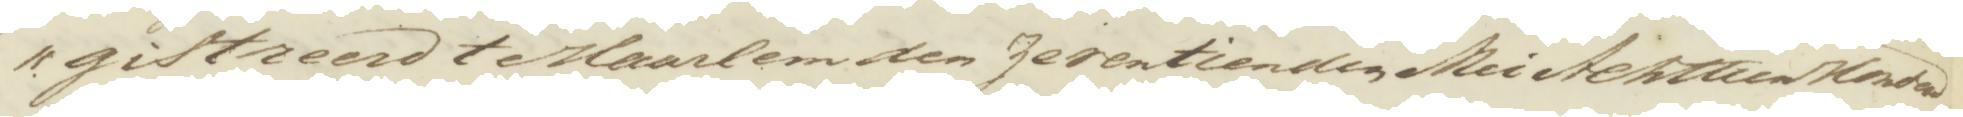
„gistreerd te Haarlem den Zeventienden Mei Achttien honderd
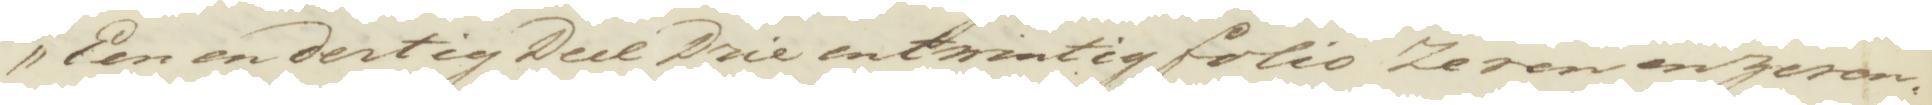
„Een en dertig Deel Drie en twintig folio Zeven en zeven„
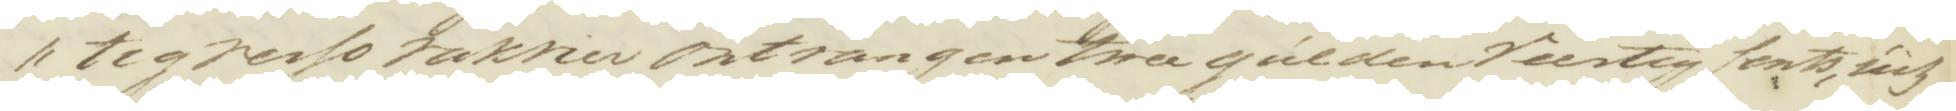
„tig verso vak vier ontvangen twee gulden Veertig Cents, uit
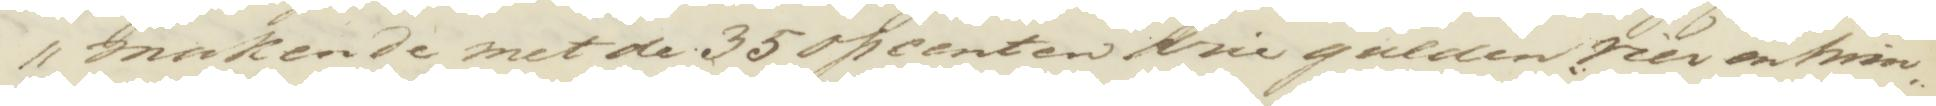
„ makende met de 35 opcenten drie gulden vier en twin
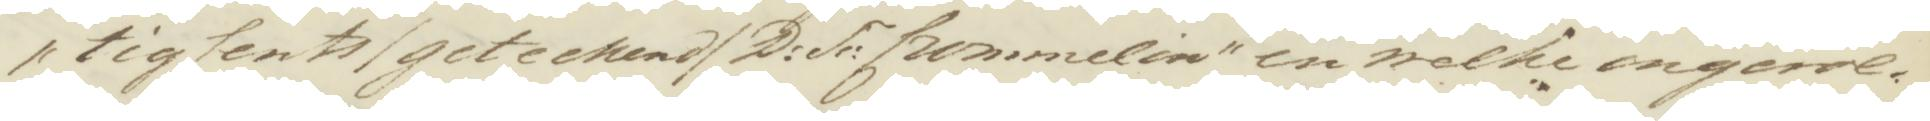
„tig Cents /geteekend/ D: F: Crommelin" en welke in gevol„
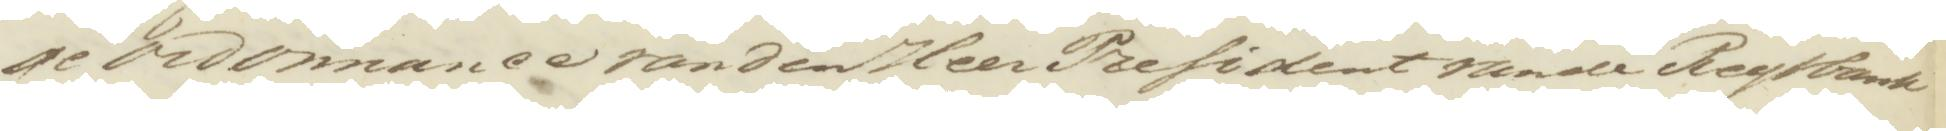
ge ordonnance van den Heer President van de Regtbank
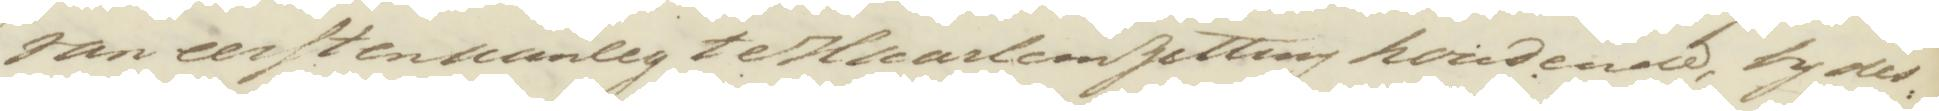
van eersten aanleg te Haarlem zitting houdende, by des„
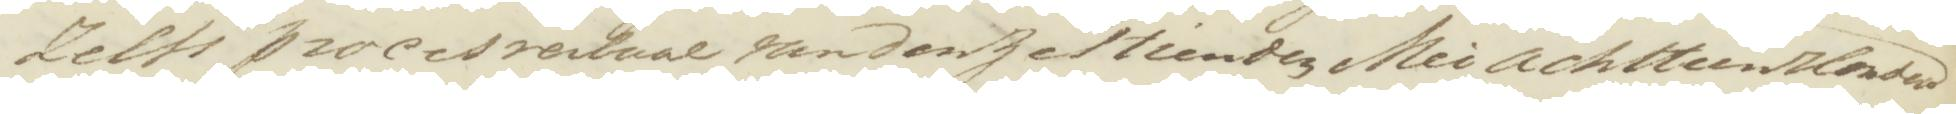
Zelfs proces verbaal van den Zestienden Mei achttien Honderd
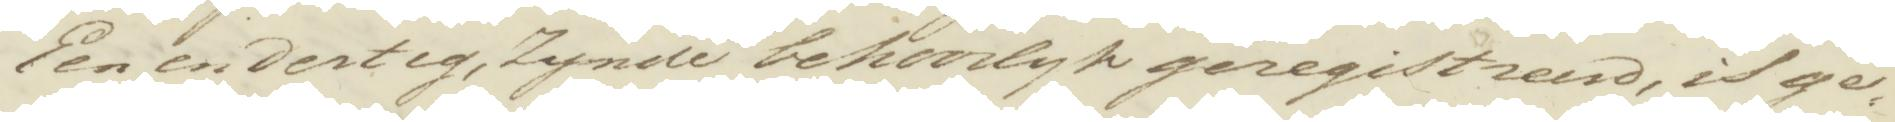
Een en dertig, Zynde behoorlyk geregistreerd, is ge„
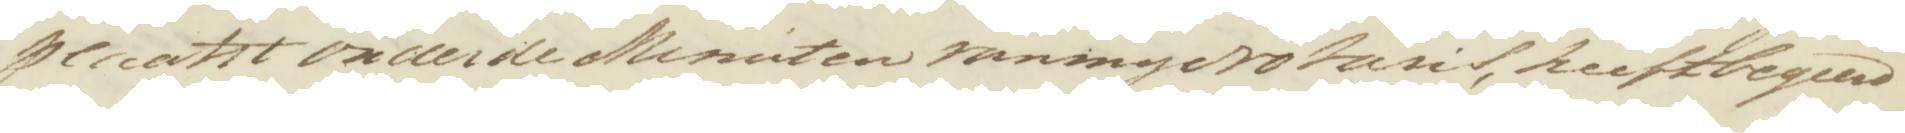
plaatst onder de Minuten van my Notaris, heeft begeerd
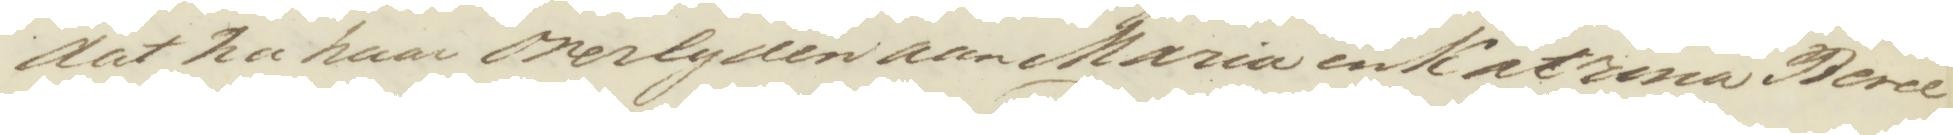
dat na haar overlyden aan Maria en Katrina Bevel
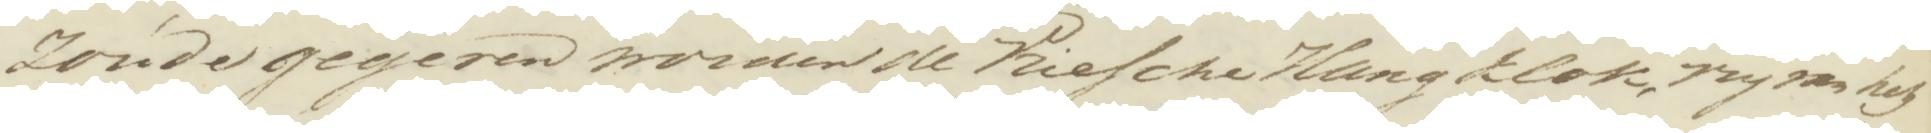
zoude gegeven worden de Vriesche Hangklok, vry van het
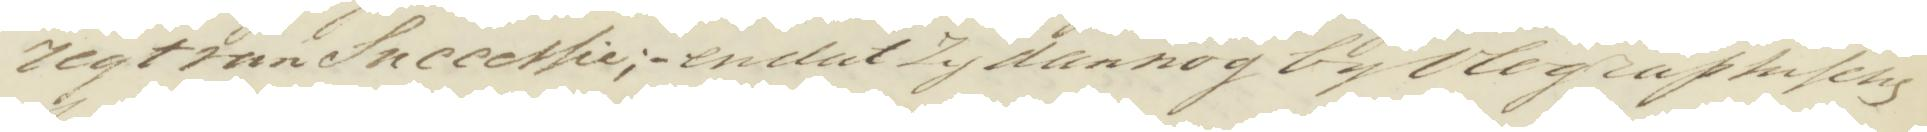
regt van Successie, - en dat zy dan nog by olegraphischen
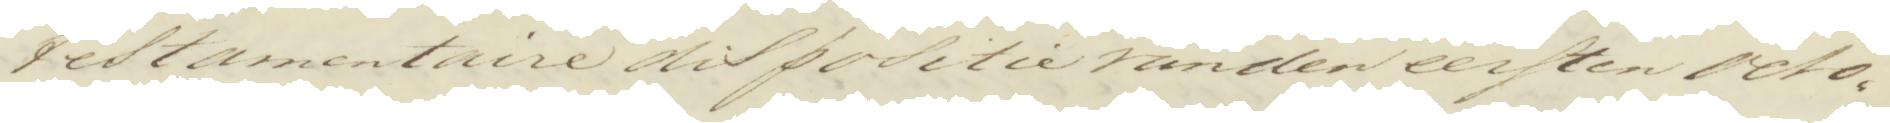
testamentaire dispositie van den eersten octo„
